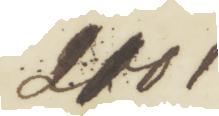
2101
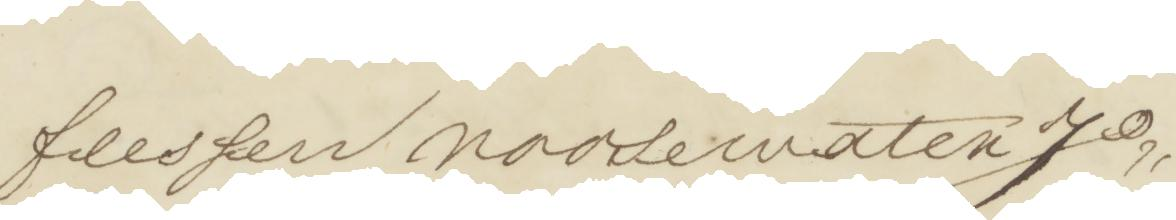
flessen roosewater J„o
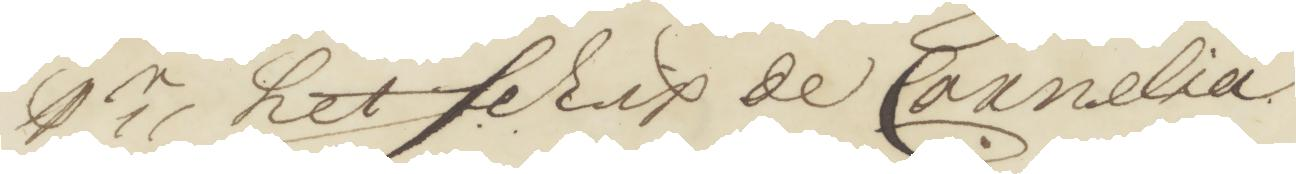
p„r het schip de Cornelia.
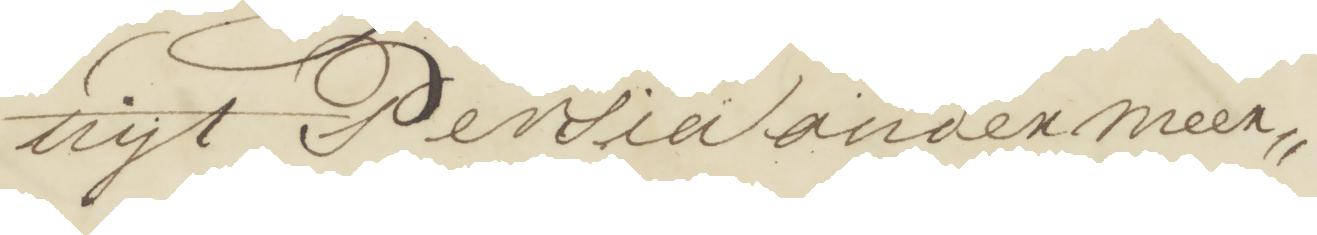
uijt Persia onder meer„
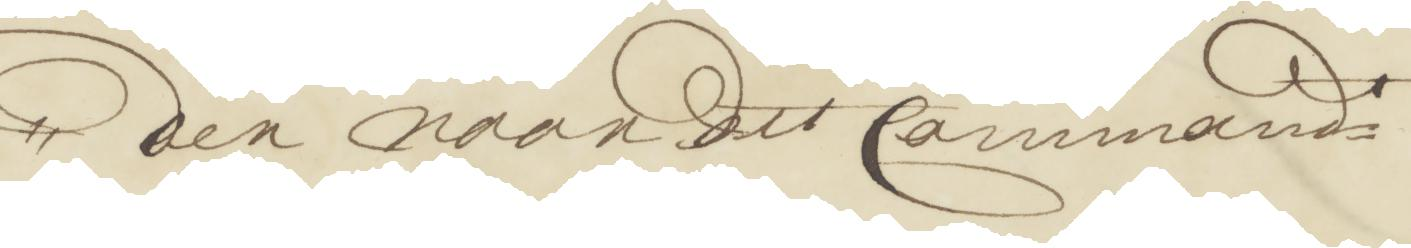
„der voor dit Command=t
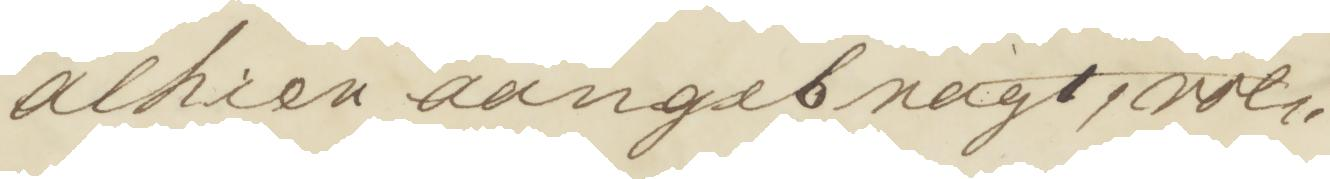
alhier aangebragt, vol„
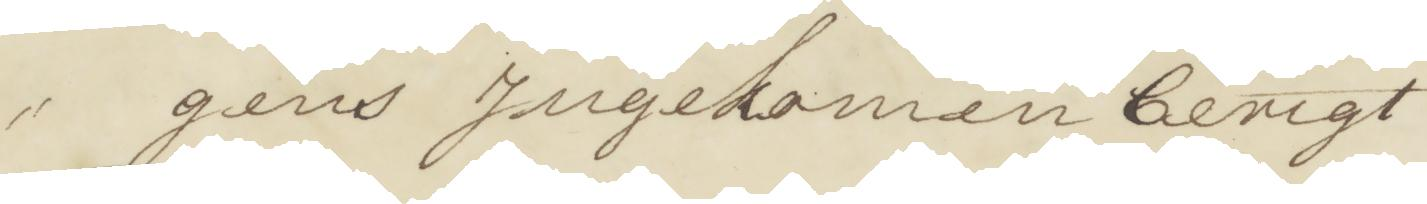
„gens jngekomen berigt
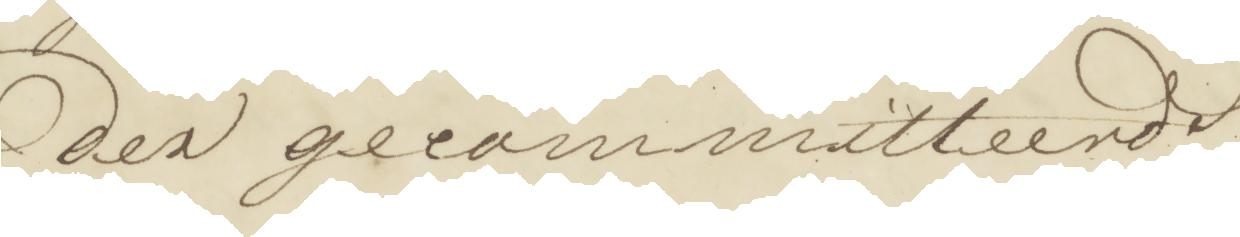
der gecommitteerd„s
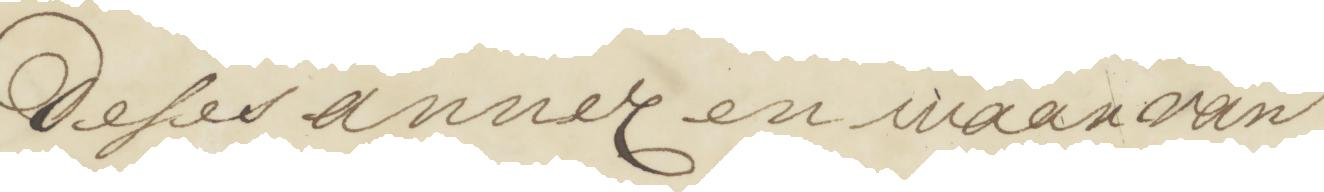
deses annex en waarvan
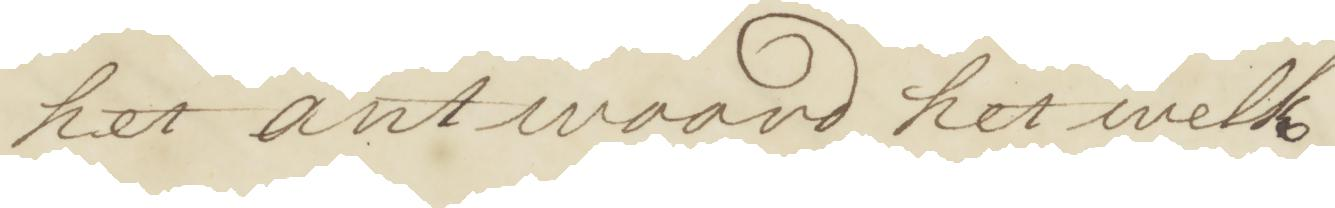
het antwoord het welk
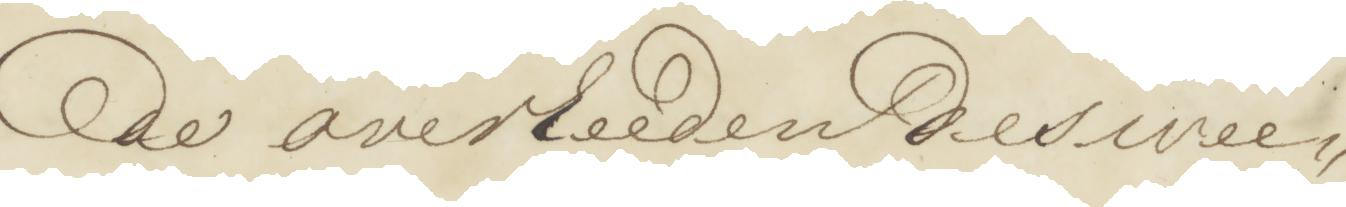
de overheeden deswee„
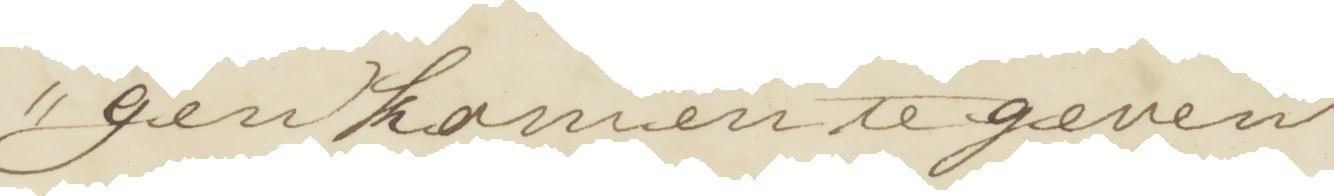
„gen komen te geven
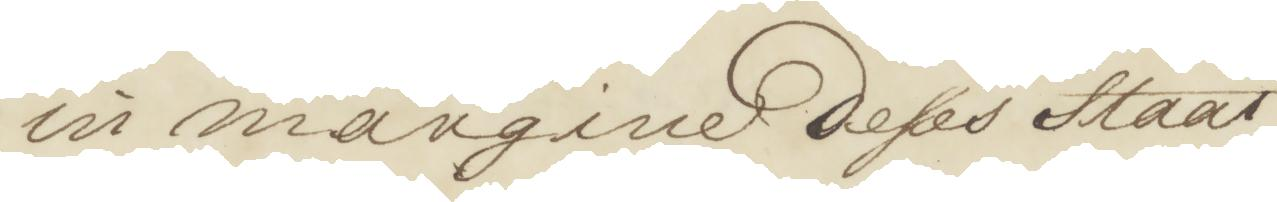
in margine deses staat
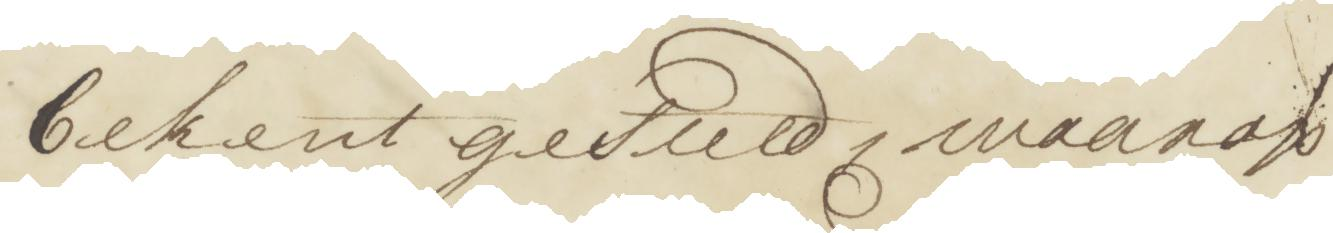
bekent gesteld, waarop
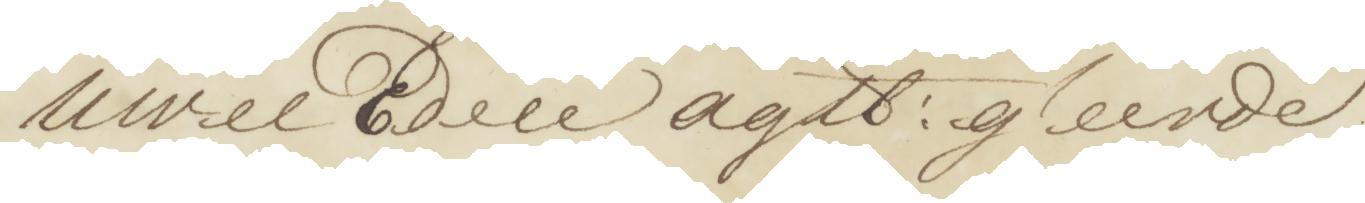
Uwel Edele agtb: g’eerde
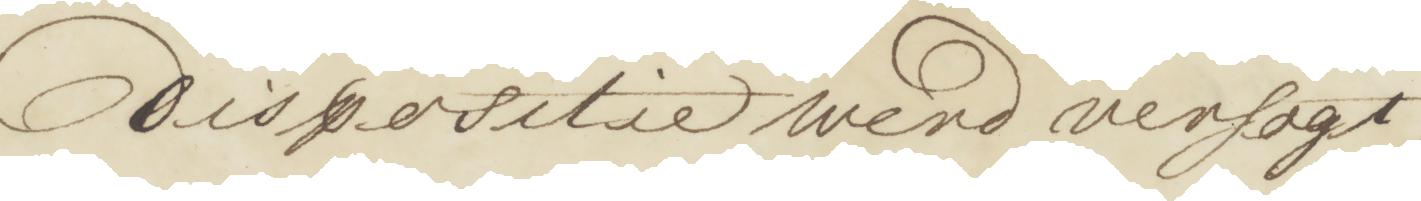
dispositie werd versogt
